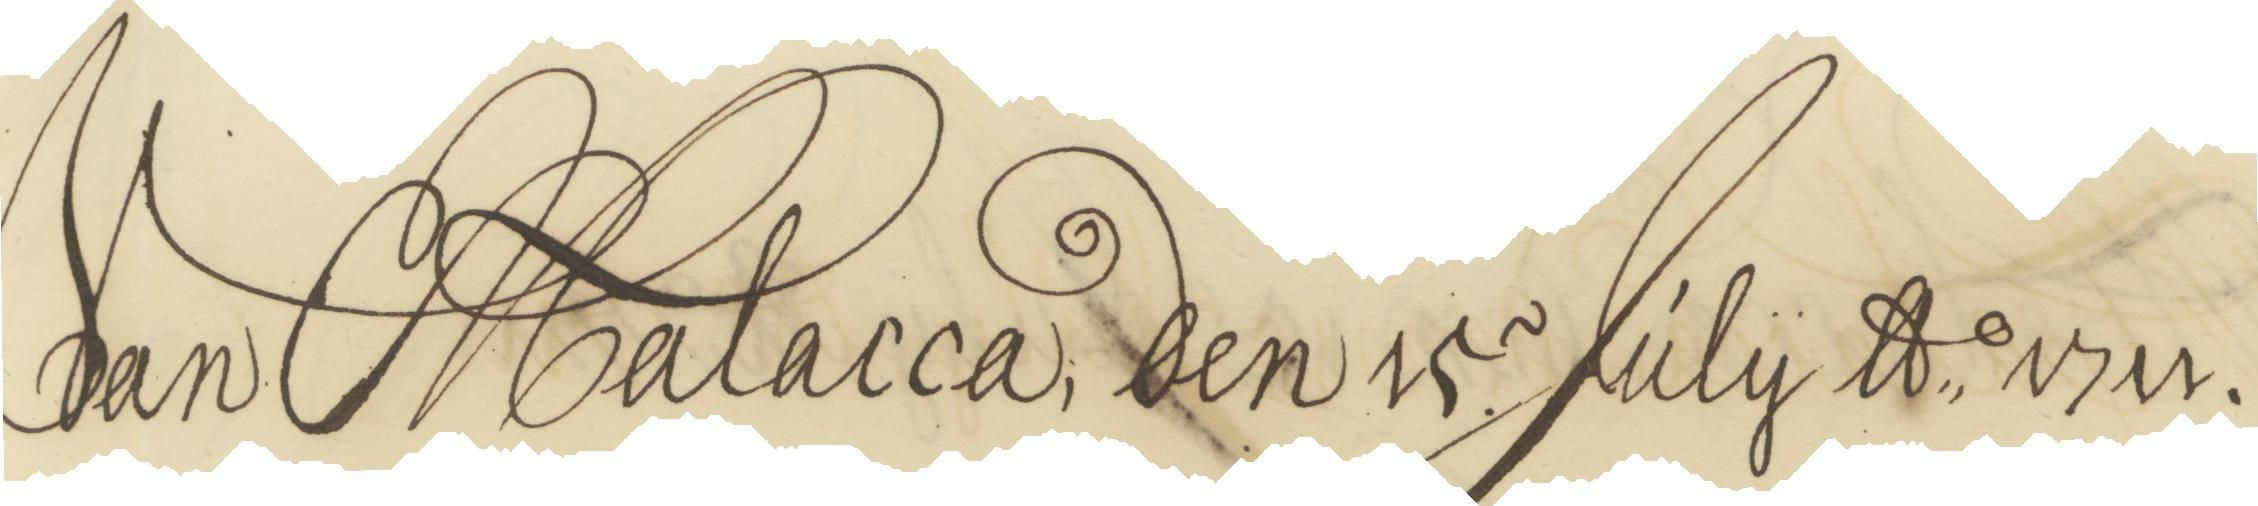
Van Malacca; den 15.' Julij A„o 1711.
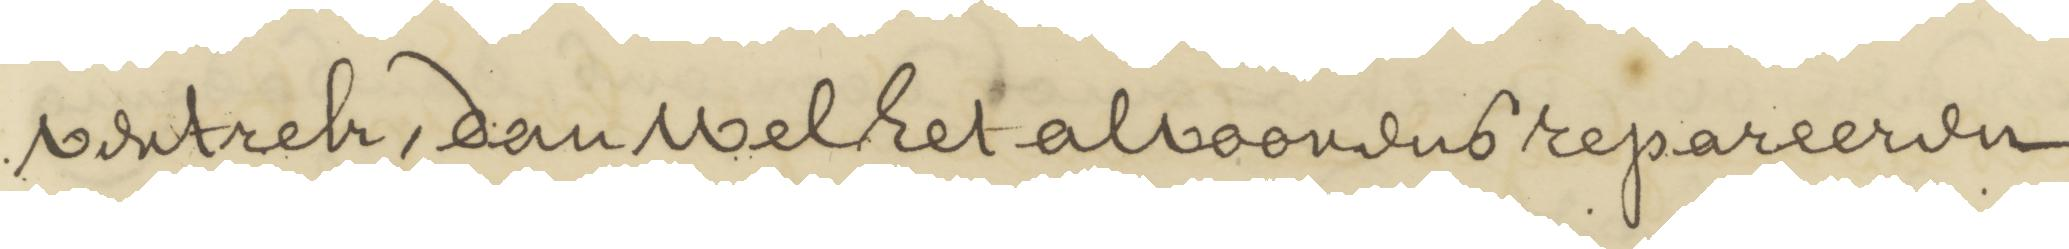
vertrek, dan wel het alvoorens repareeren
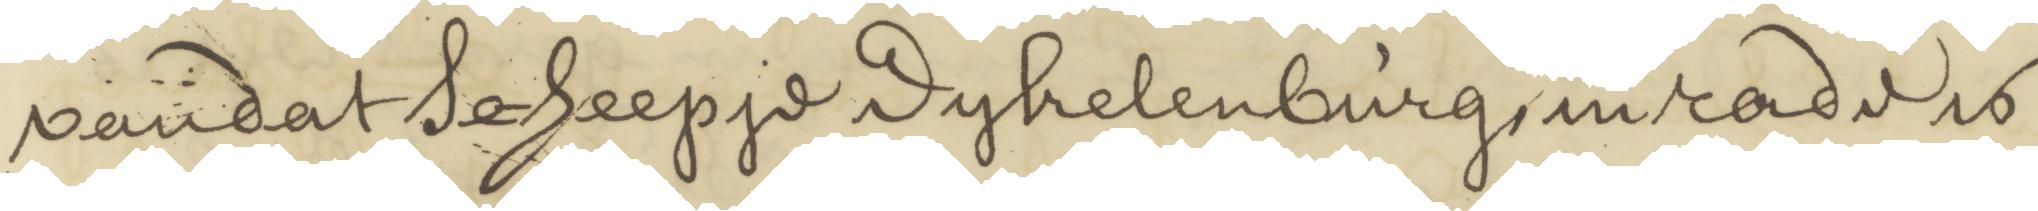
van dat Scheepje Eykelenburg, in rade is
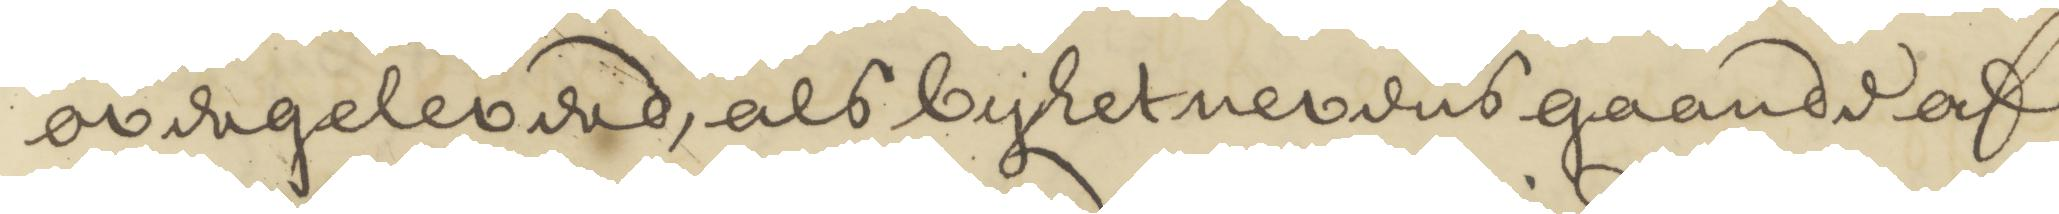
overgeleverd, als bij het nevens gaande af
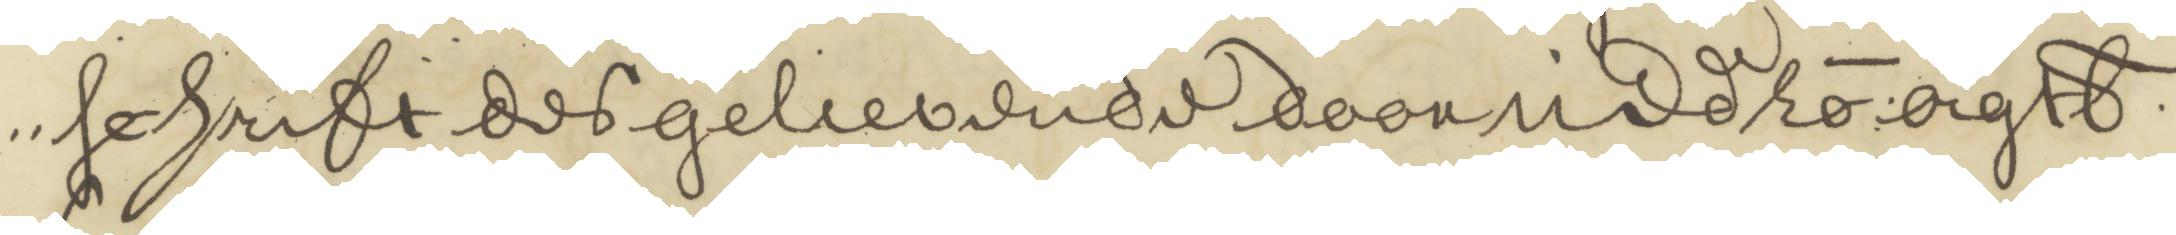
„schrift des gelievende door u Ed:e ho: agtb.
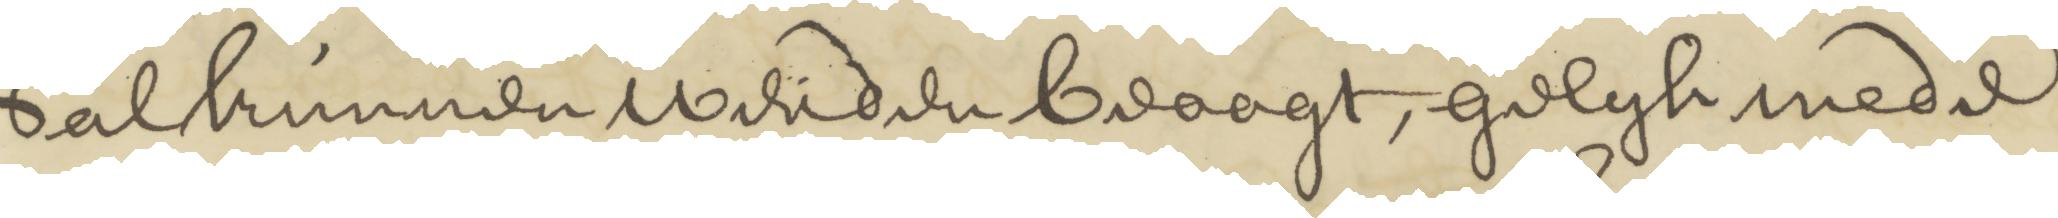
Sal kunnen werden beoogt, gelyk mede
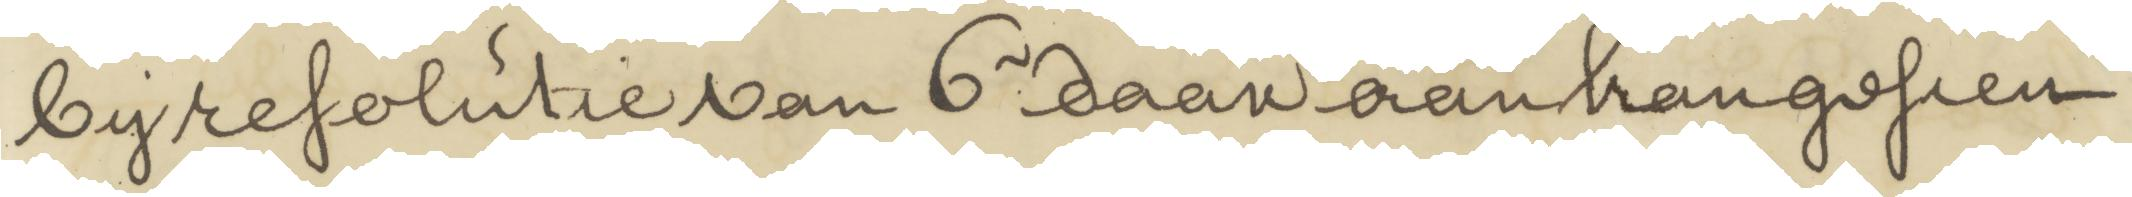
bij resolutie van 6' daar aan kan gesien
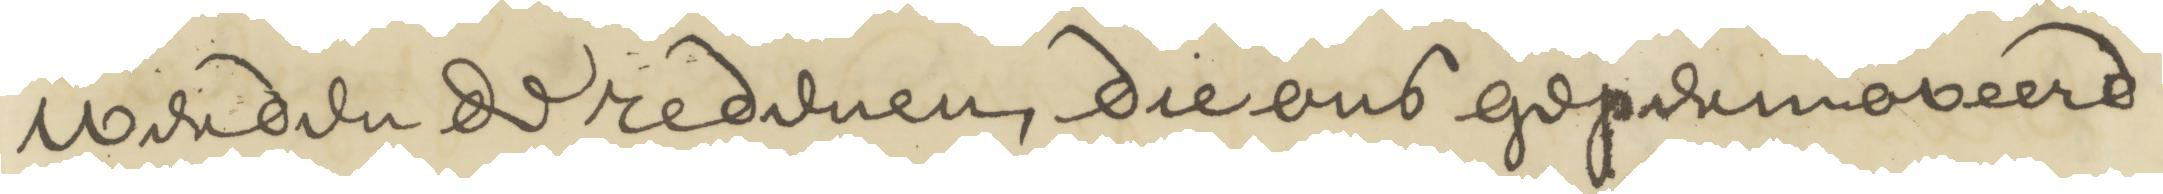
werden de redenen, die ons gepermoveerd
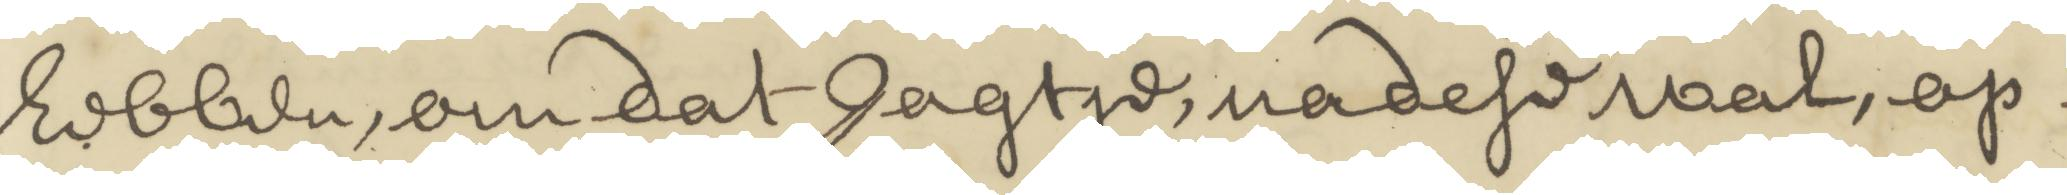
hebben, om dat Jagtje, na dese wal, op
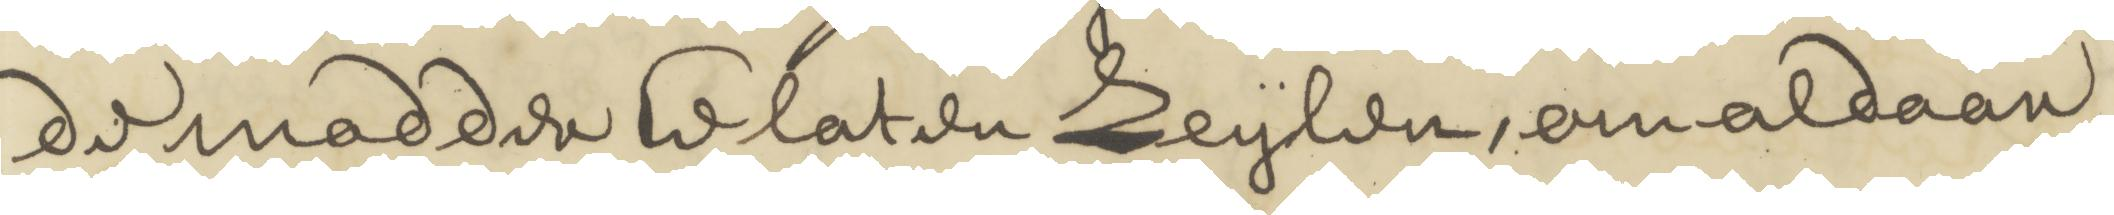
de modder te laten Zeijlen, om aldaar
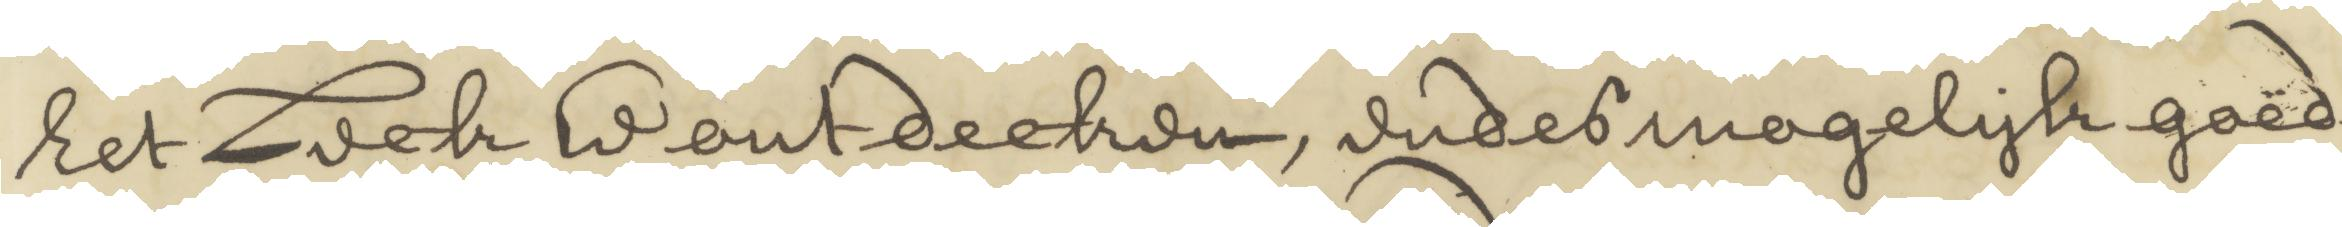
het Leck te ontdecken, endes mogelijk goed
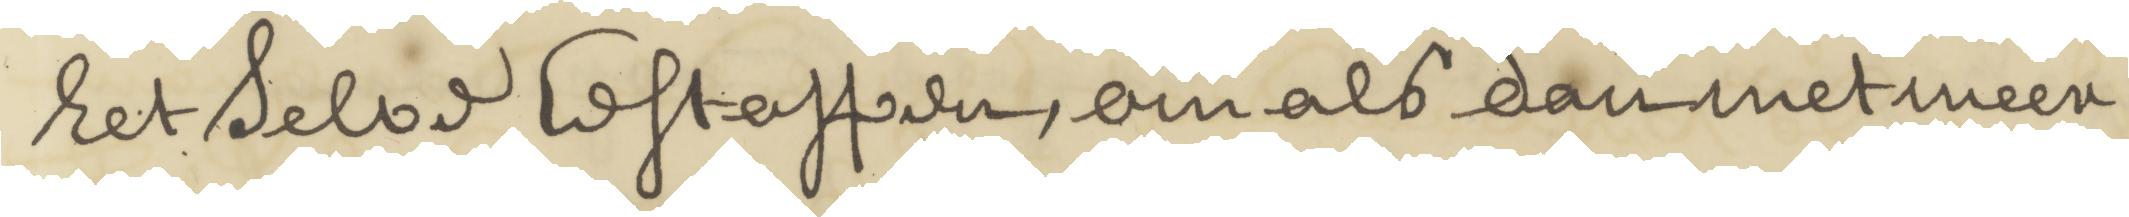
het Selve testoppen, om als dan met meer
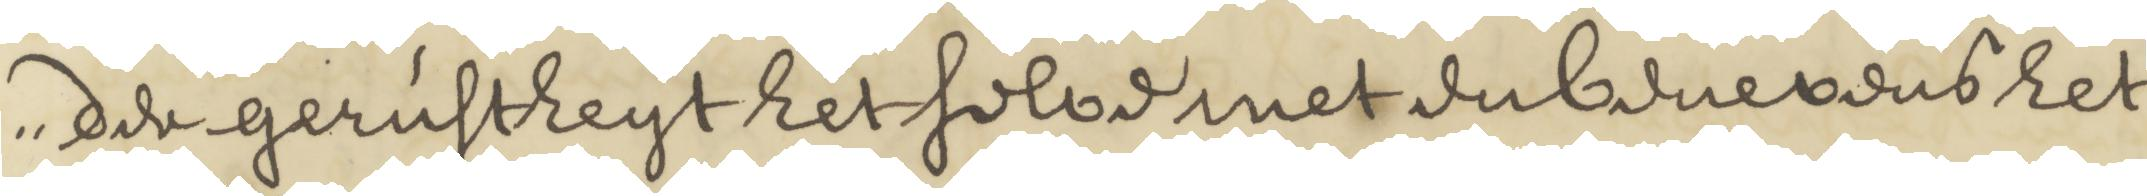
„der gerustheyt het selve met en benevens het
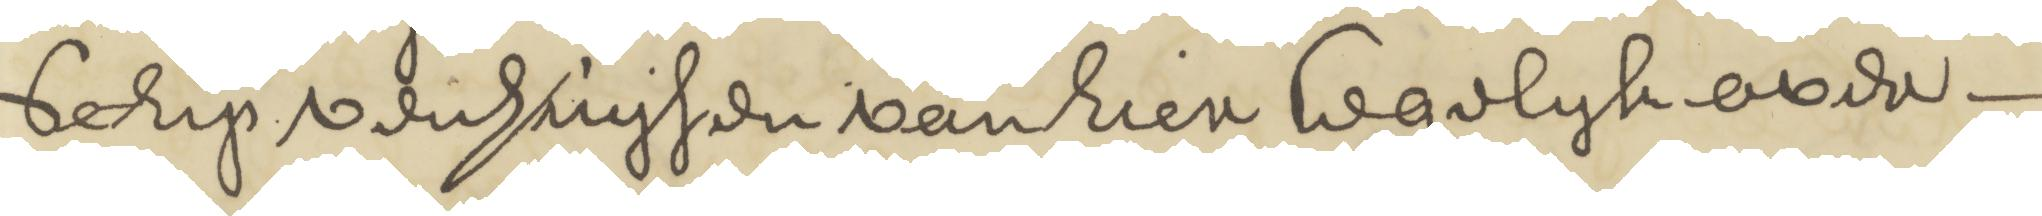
schip venhuijsen van hier tegelyk over -
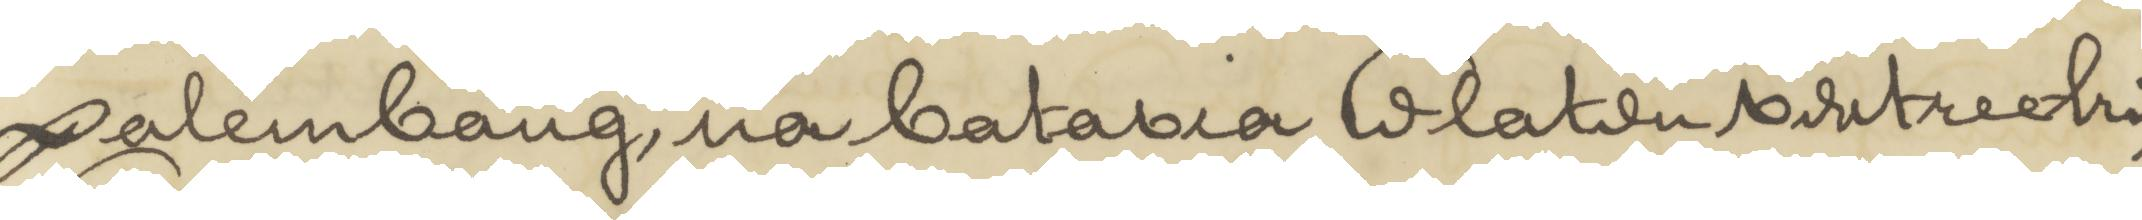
palembang, na batavia te laten vertrecken
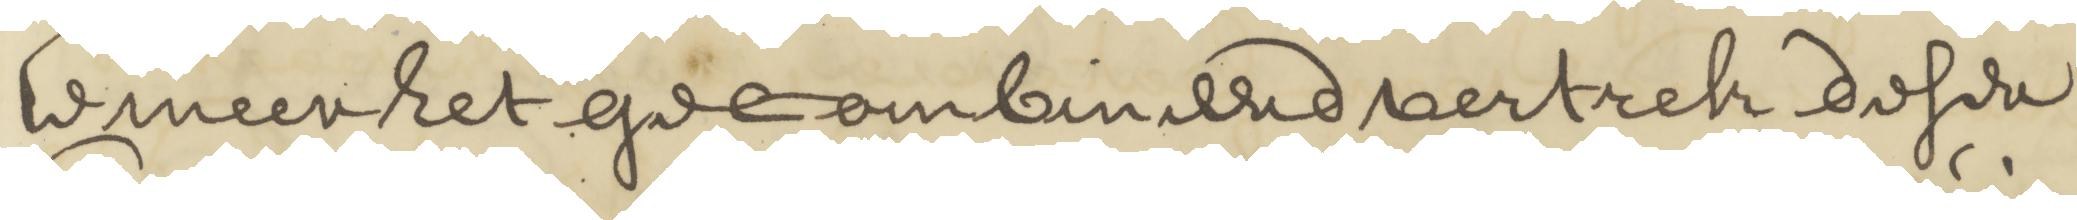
te meer het gecombineerd vertrek deser
